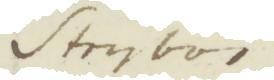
Strybos
